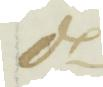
d_o
